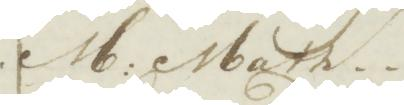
M: Math. . . . . . .
